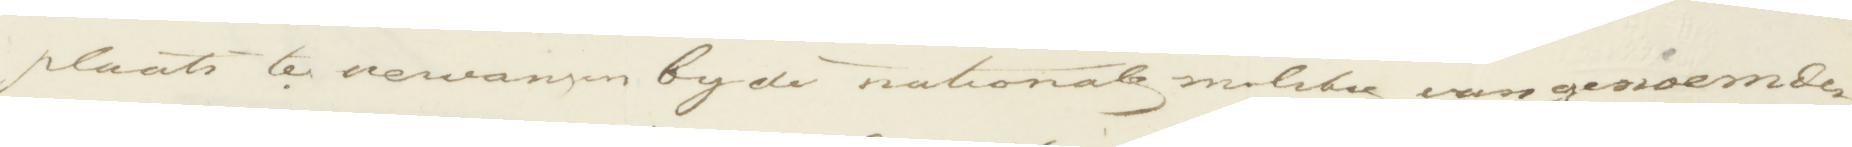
plaats te vervangen by de nationale militie van genoemden
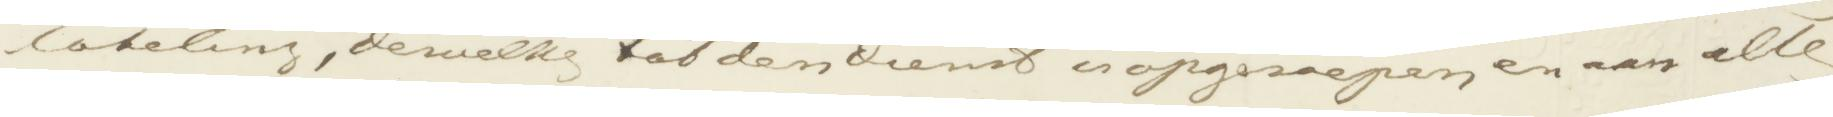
loteling, dewelken tot den dienst is opgeroepen en aan alle
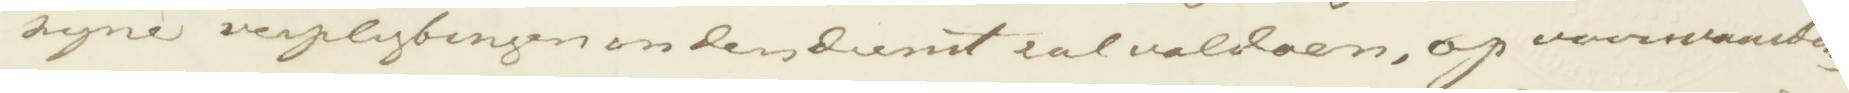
zyne verpligtingen in den dienst zal voldoen, op voorwaarden
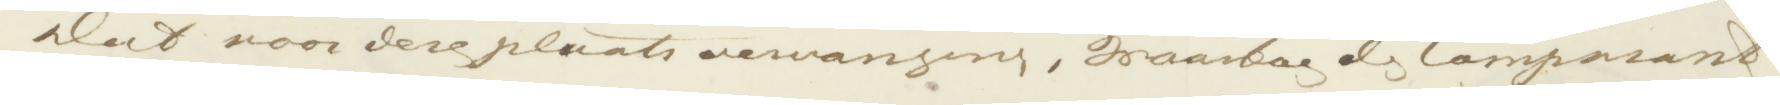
Dat voor deze plaats vervanging, waartoe den Comparant
